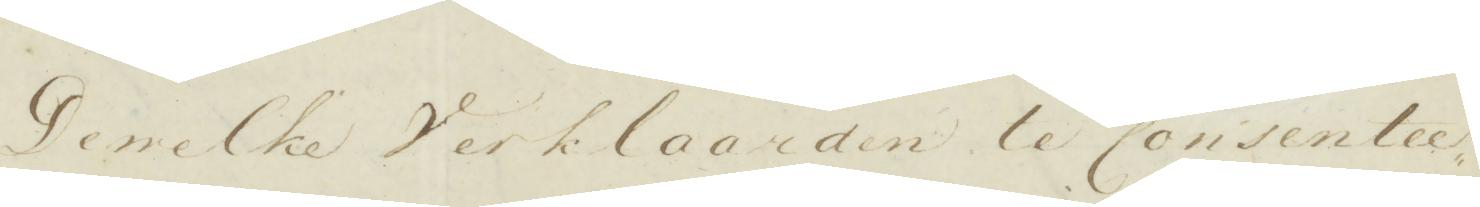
Dewelke Verklaarden te consentee„
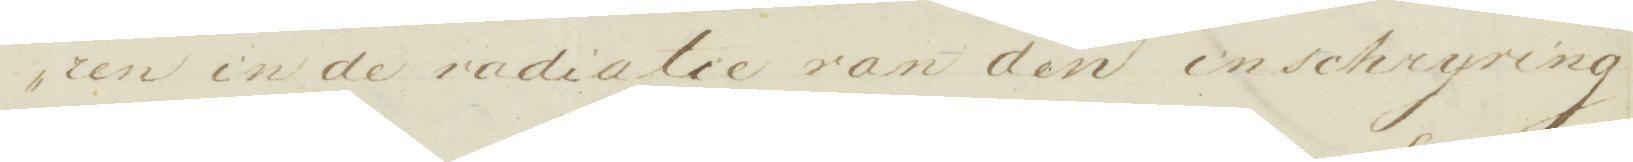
„ren in de radiatie van den inschrijving
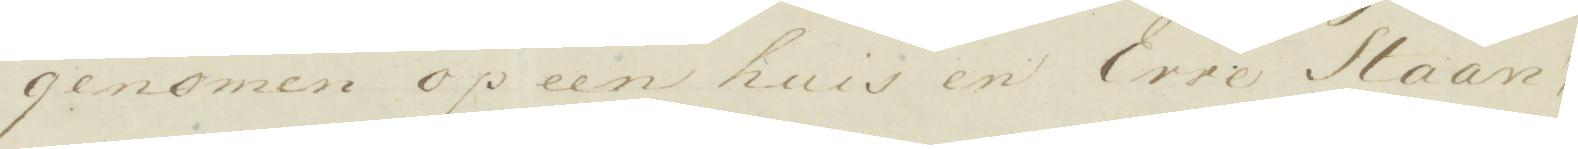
genomen op een huis en Erve staan„
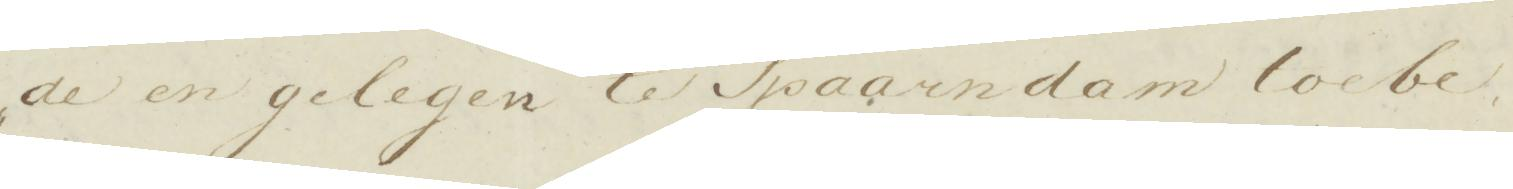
„de en gelegen te spaarndam toebe„
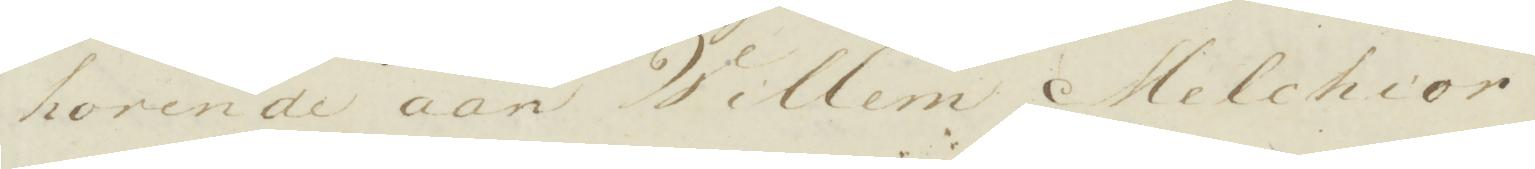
horende aan Willem Melchior
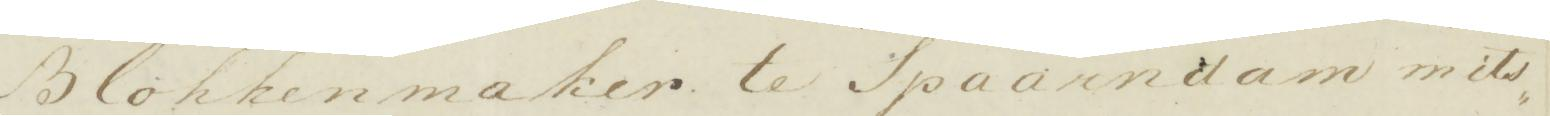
Blokkenmaker te spaarndam mits„
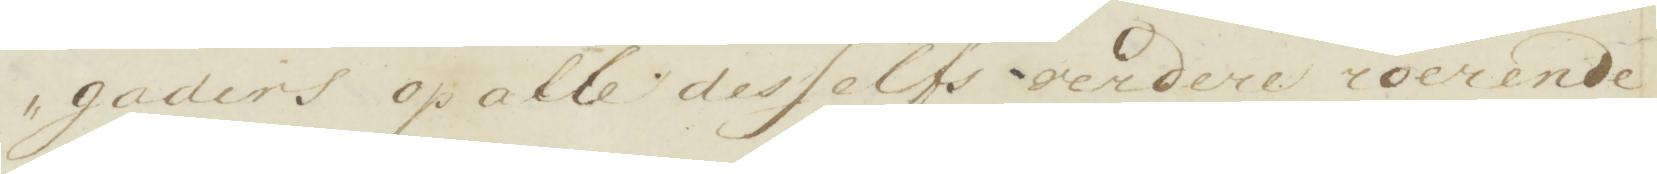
„gaders op alle desselfs verdere roerende
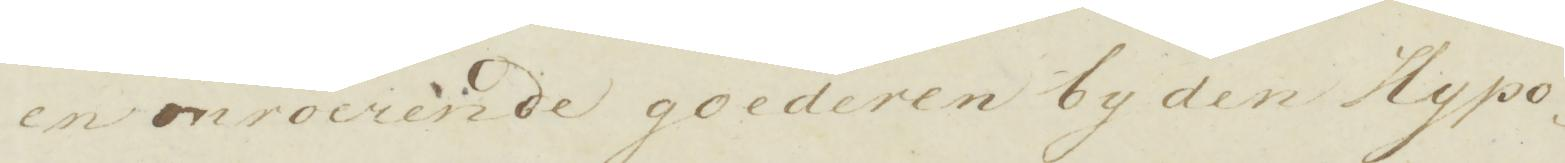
en onroerende goederen by den Hypo„
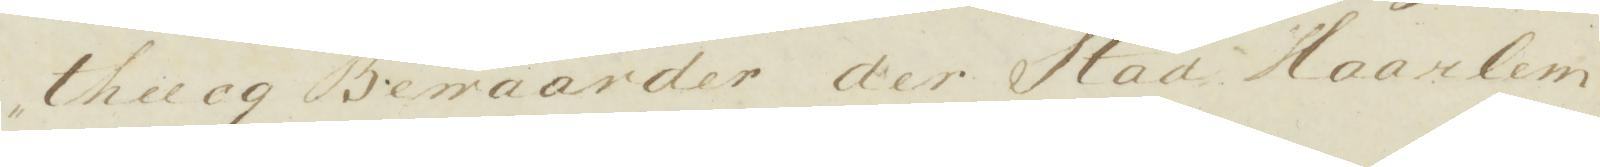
„theecq Bewaarder der stad Haarlem
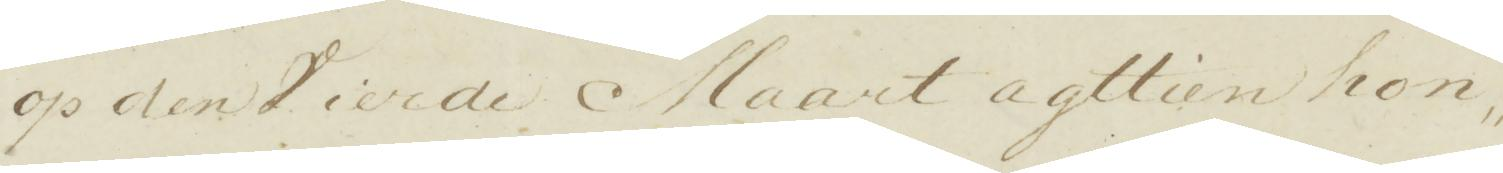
op den Vierde Maart agttien hon„
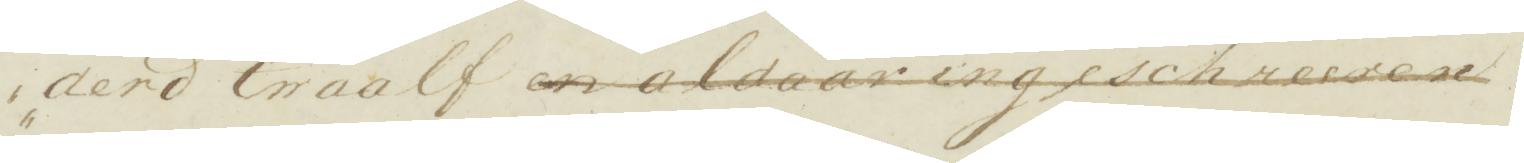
„derd twaalf en aldaar ingeschreeven
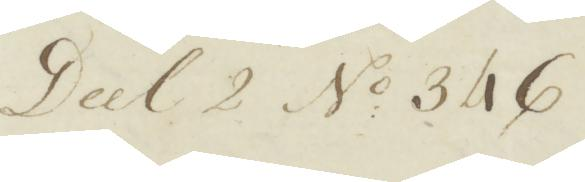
Deel 2 N:o 346
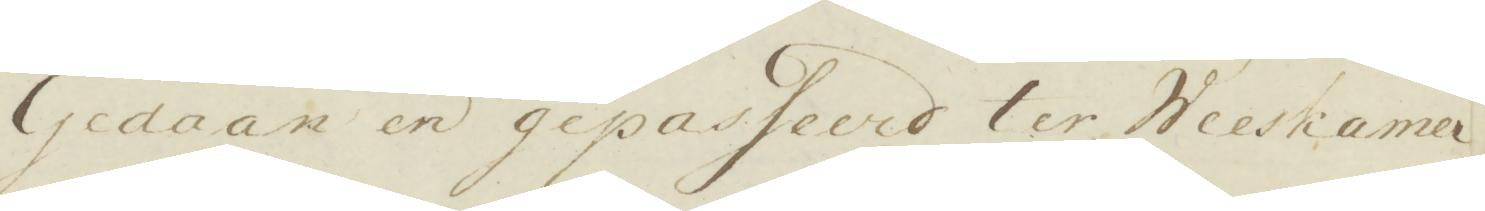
Gedaan en gepasseerd ter Weeskamer
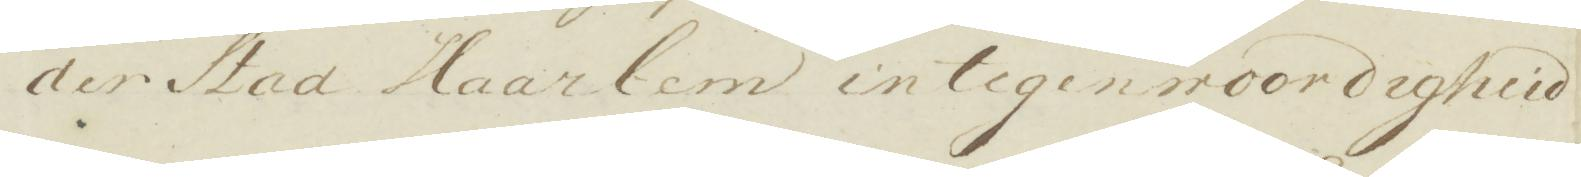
der stad Haarlem integenwoordigheid
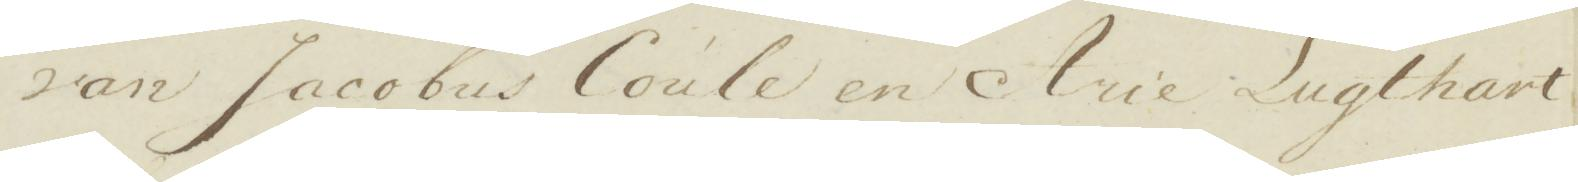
van Jacobus Coule en Arie Lugthart
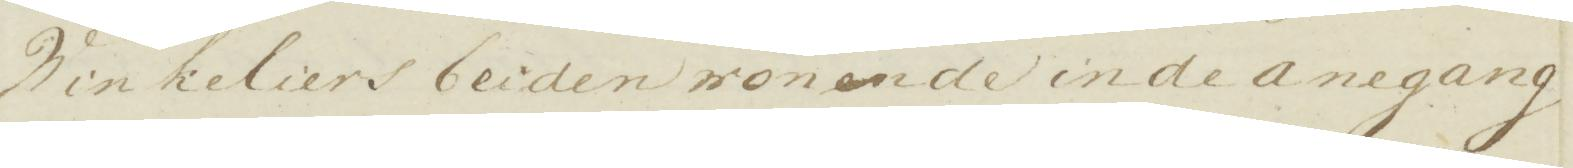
Winkeliers beiden wonende in de anegang
